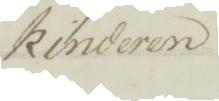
kinderen
